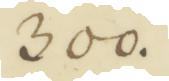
300.
